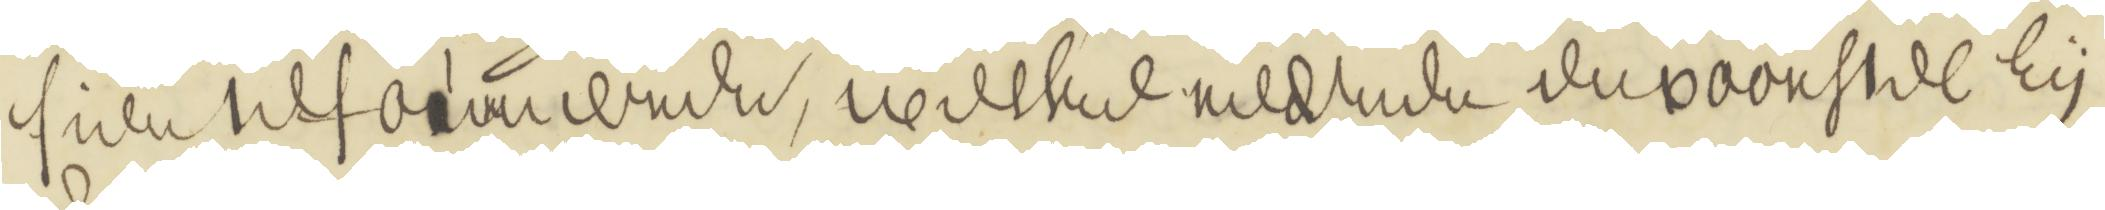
sien tefourneeren, welke redenen en voorstel hij
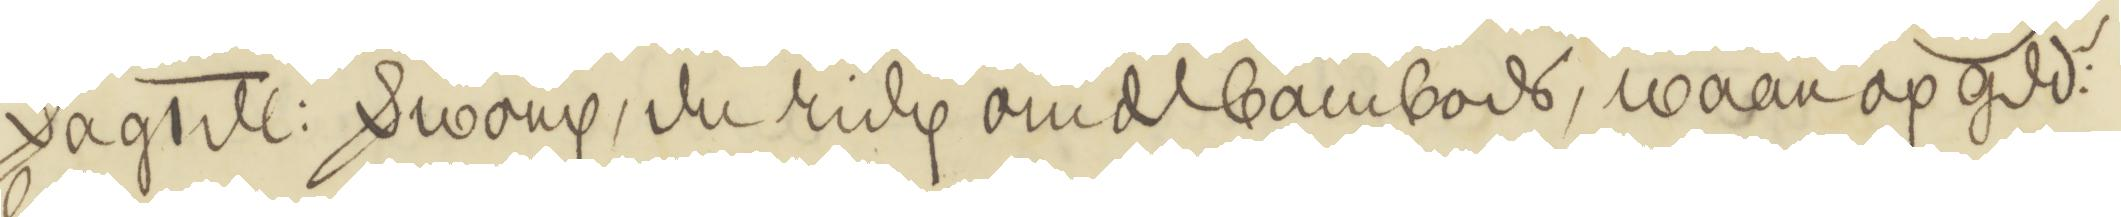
veragtel: verworp, en riep om de bamboes, waar op ged:'
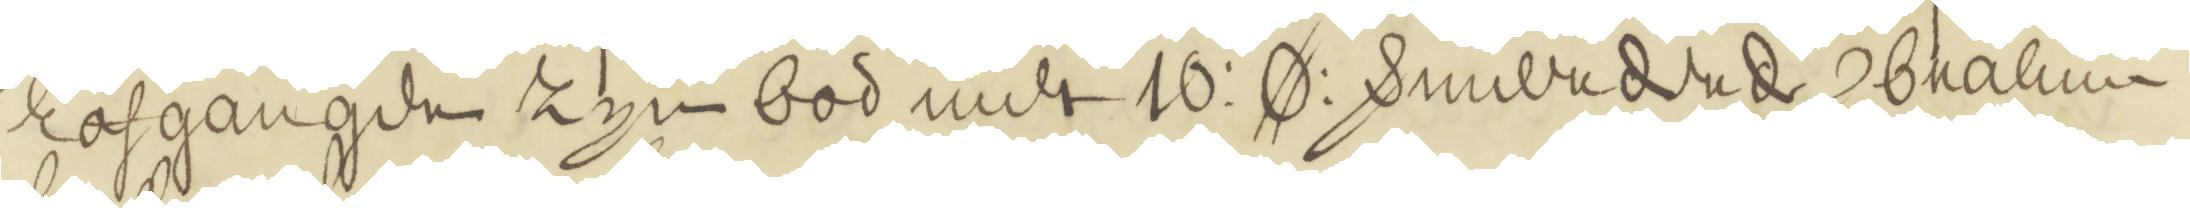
hofganger Zyn bod met 10: O: vermeerderde Jbrahim
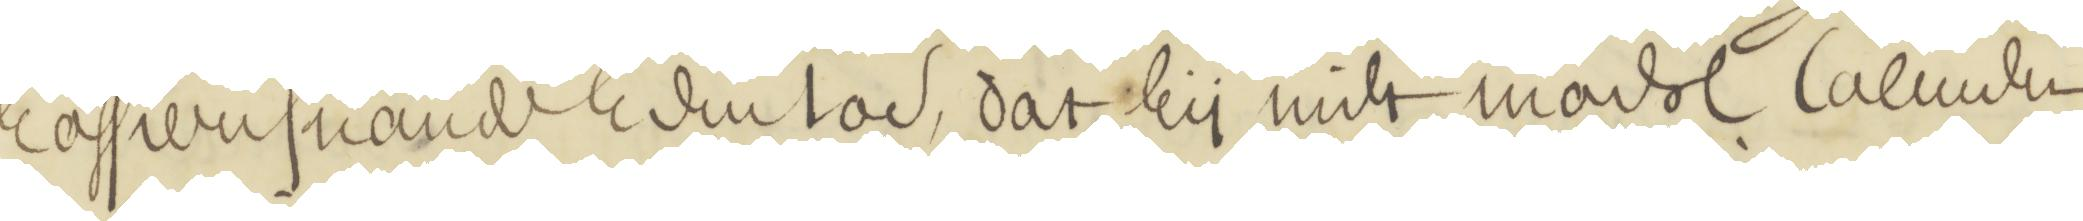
hassieri snaude hem toe, dat hij niet moest talmen
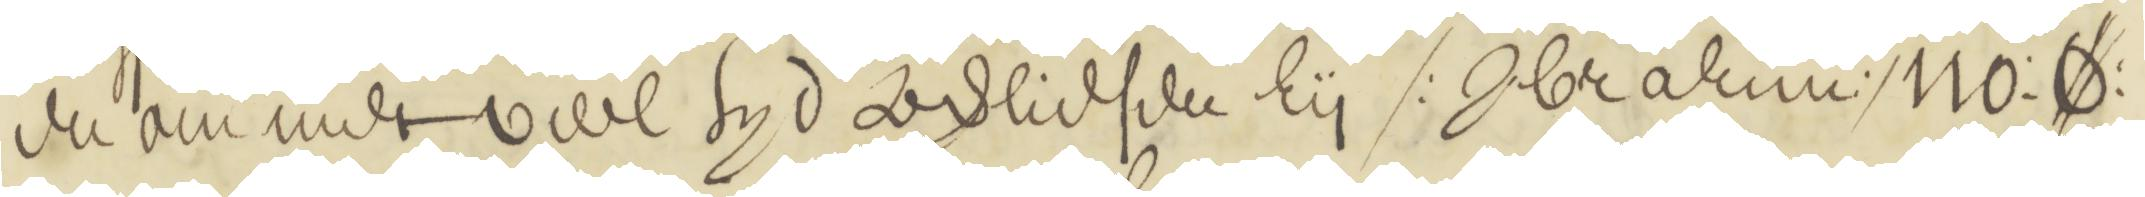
en om met veel tyd teverliesen hij /: Jbrahim :/ 110: O:
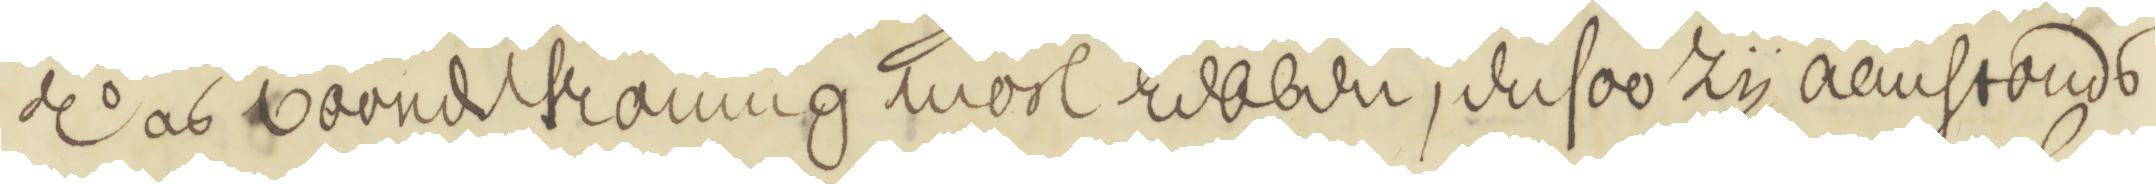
Roas voor de koning most hebben, en soo zij aanstonds
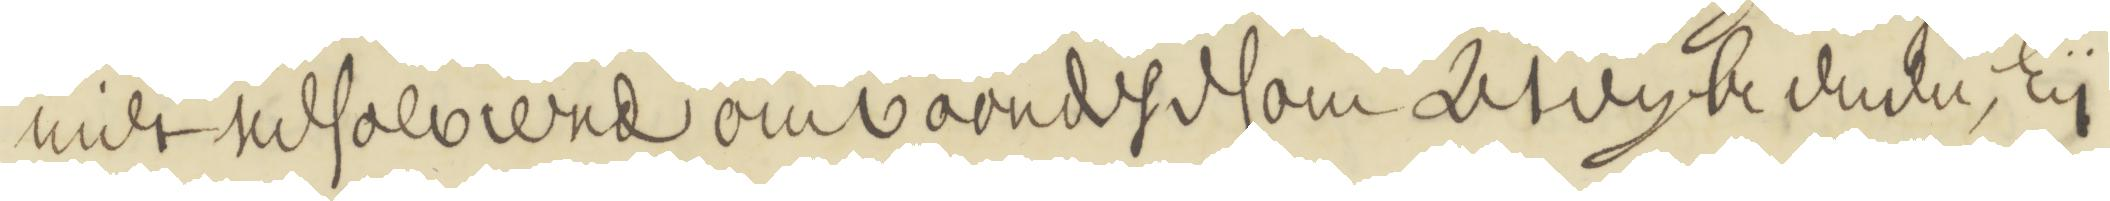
niet resolveerd om voor dese som teteykenen, hij
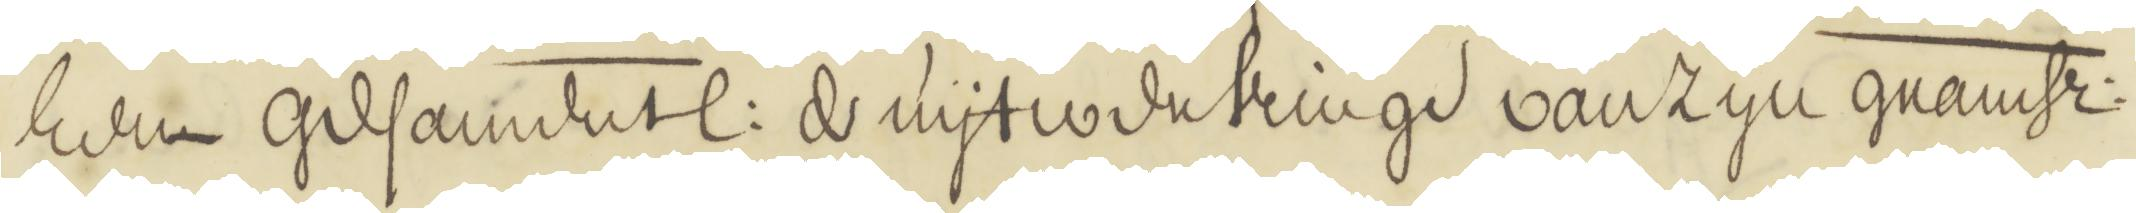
hem gesamentl: de uijtwerkinge van zyn gramsr:
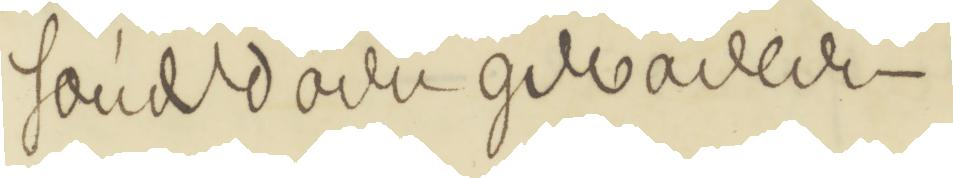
soude doen gevoelen
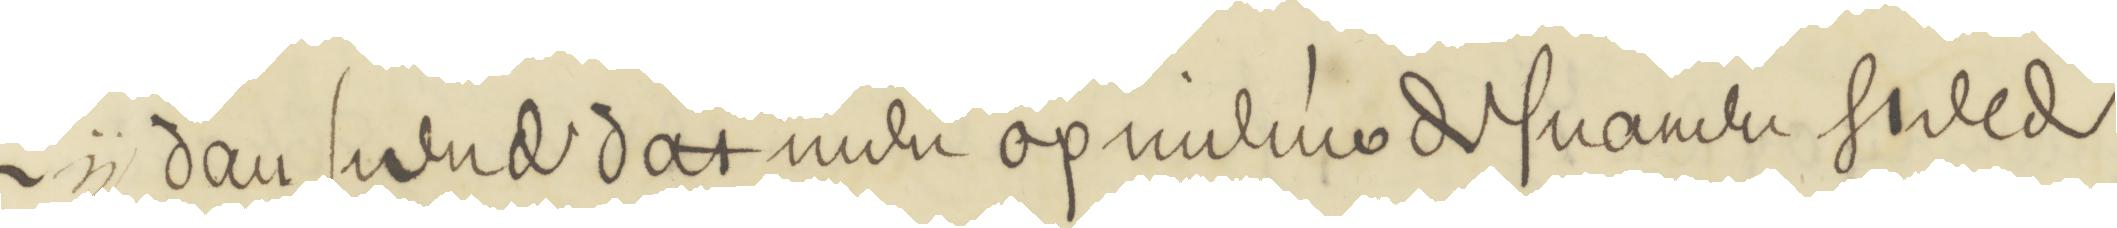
Zij dan siende dat men op nieuw de snaren stelde
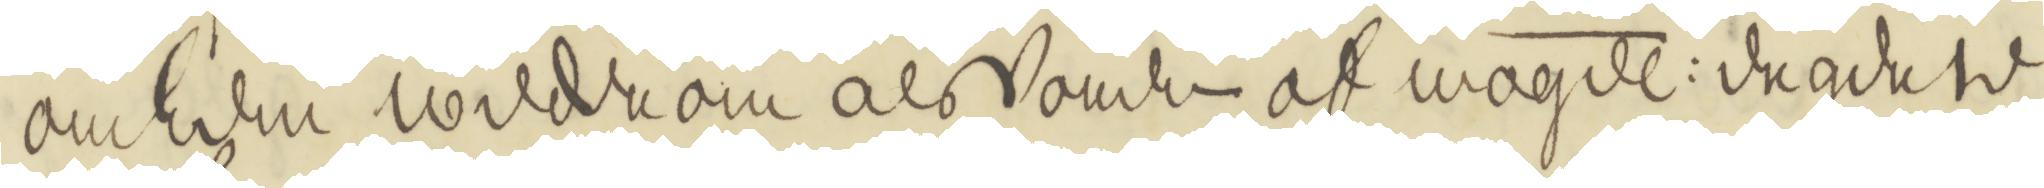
om hem wederom als voren af mogel: erger te
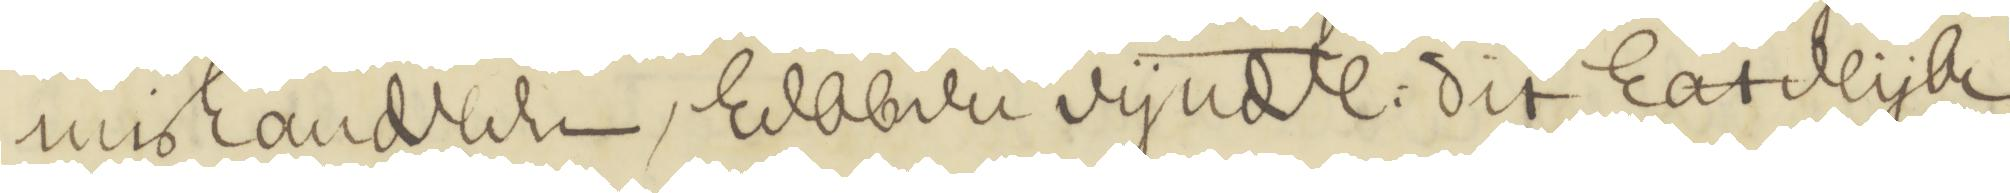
mishandelen, hebben eijndel: dit hatelijk
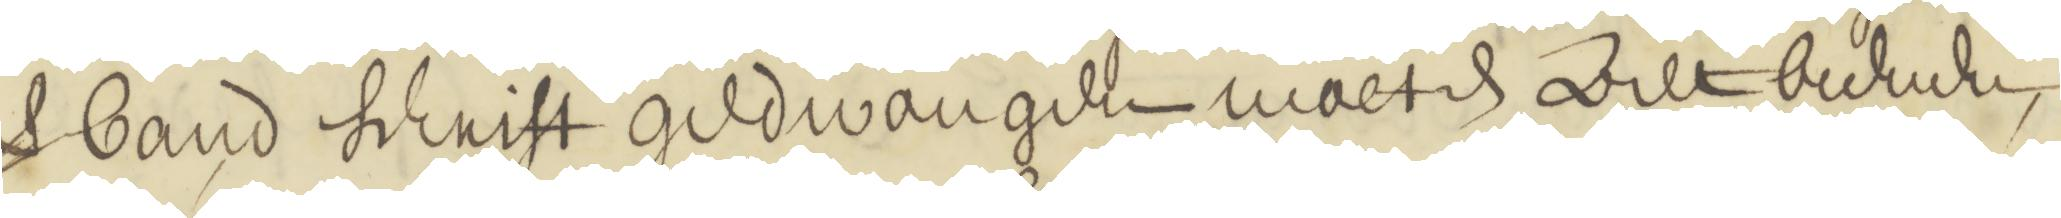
verband schrift gedwongen moeten teckenen,
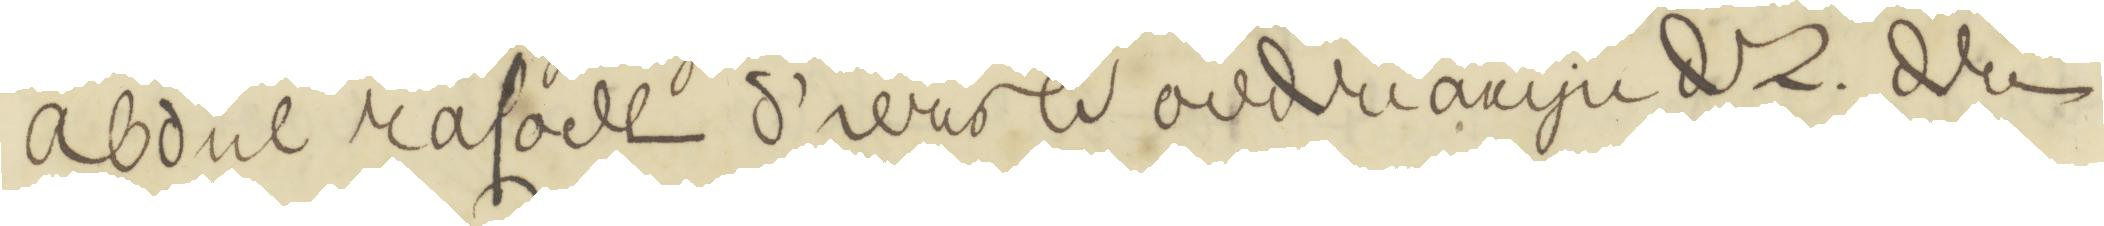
abdul rasoel d’eerste oedriarijn de 2. den
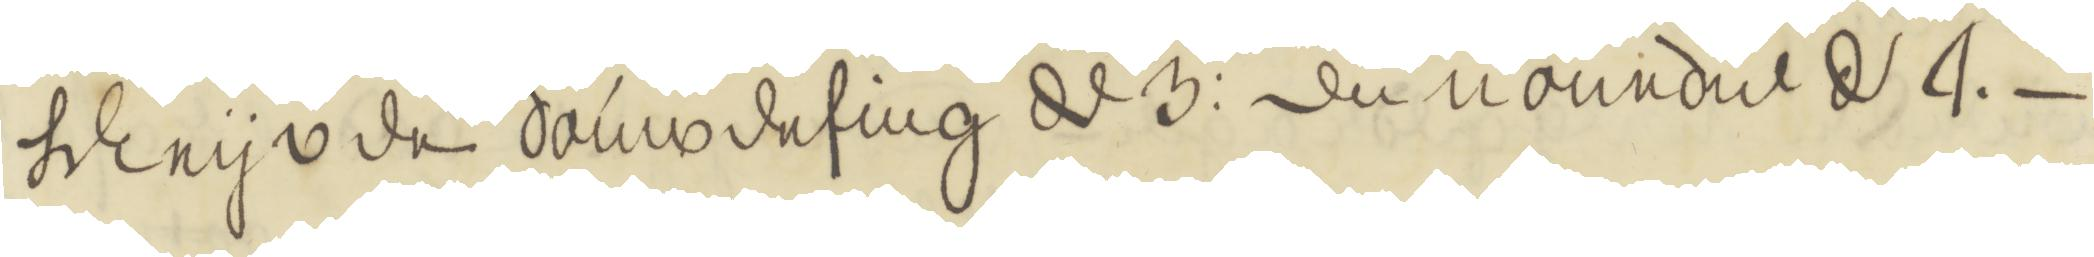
schrijver douwersing de 3: en nourdie de 4. –
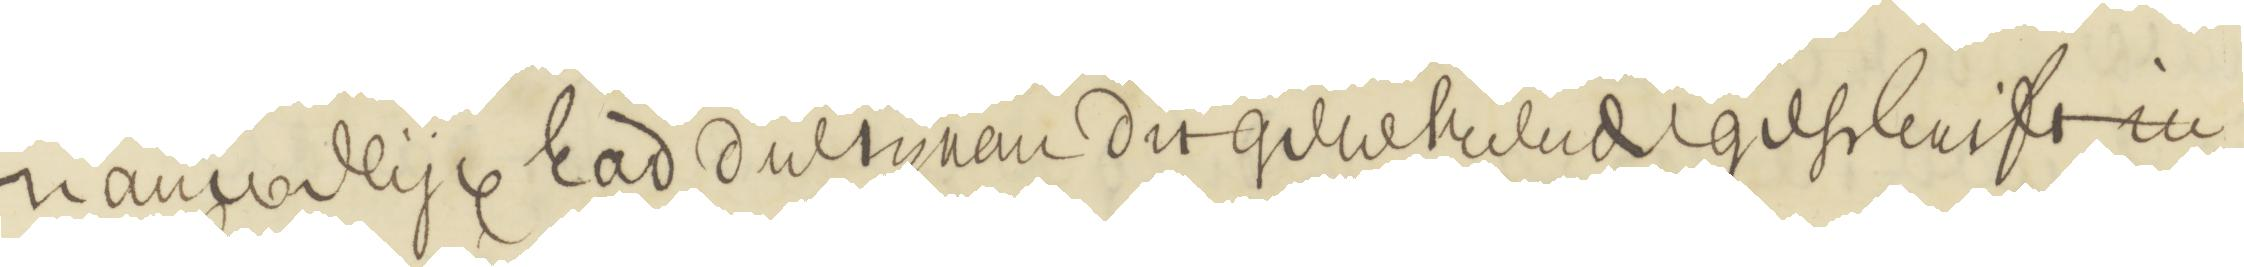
nauwelijx had die tyran dit getekende geschrift in
